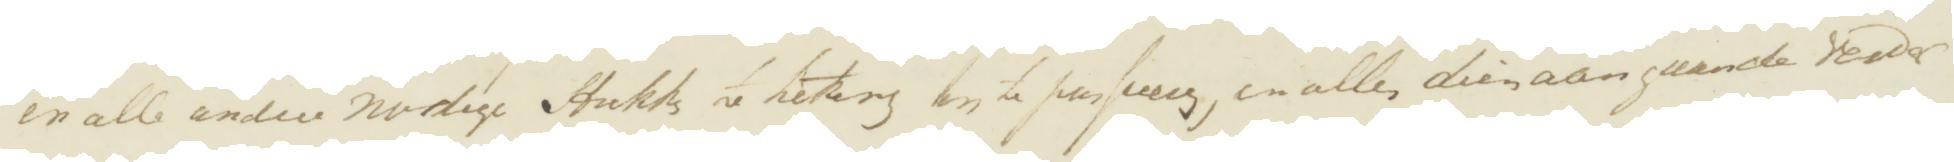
en alle andere nodige stukken te tekenen en te passeeren, en allen dien aan gaande verder
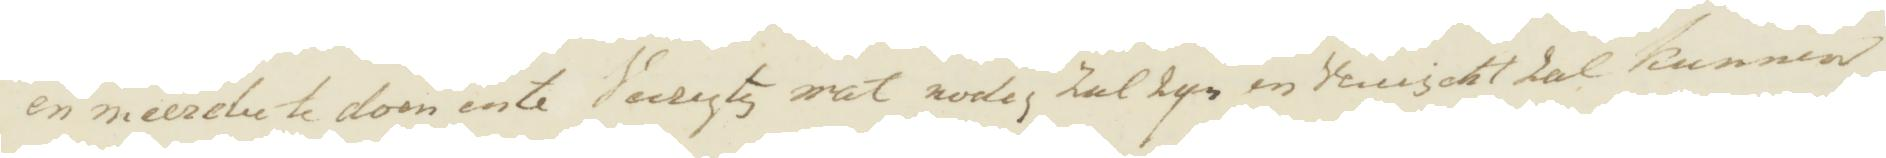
en meerder te doen en te Verrigten wat nodig zal zyn en verricht zal kunnen
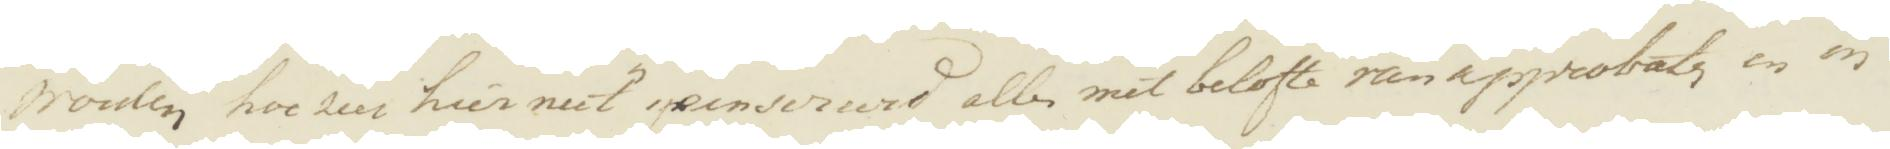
worden hoe zeer hier niet geinsereerd allen met belofte van approbaten en in
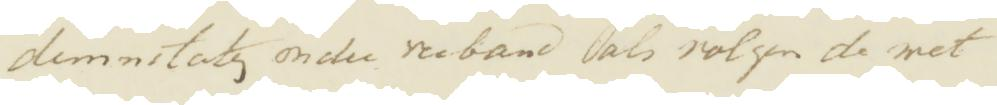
demnitaten onder verband als volgen de wet
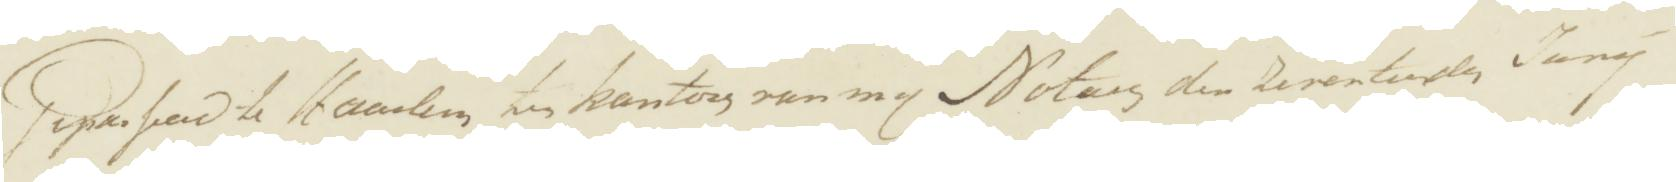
Gepasseerd te Haarlem ten kantoren van my Notaris den zeventienden Juny
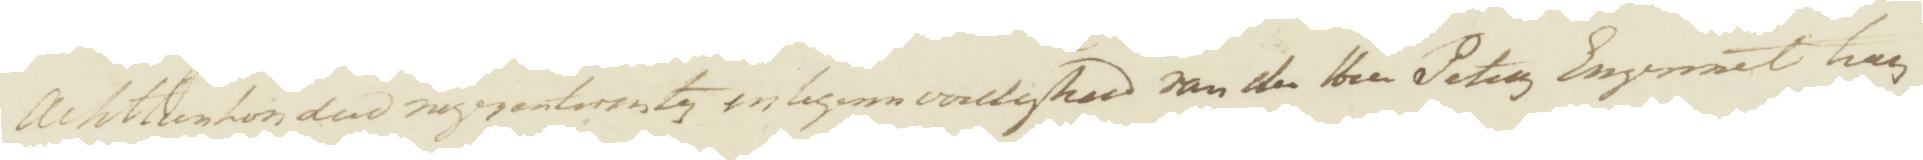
Achttienhonderd negenentwintig in tegenwoordigheid van den Heer Pieter Engesmet her
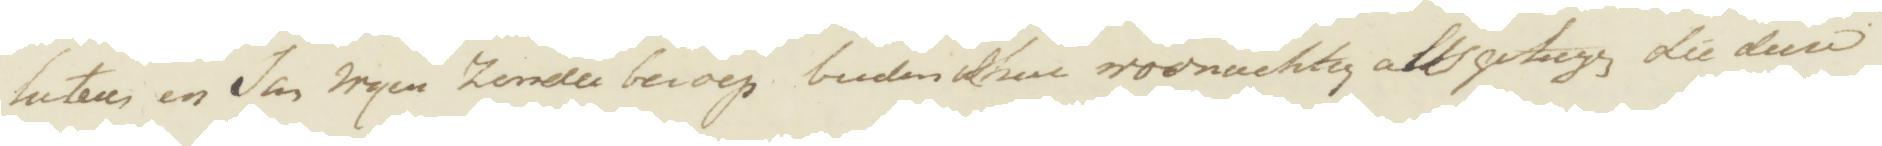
laten en Ian Vryen zonder beroep beiden alhier woonachtig als getuigen die deese
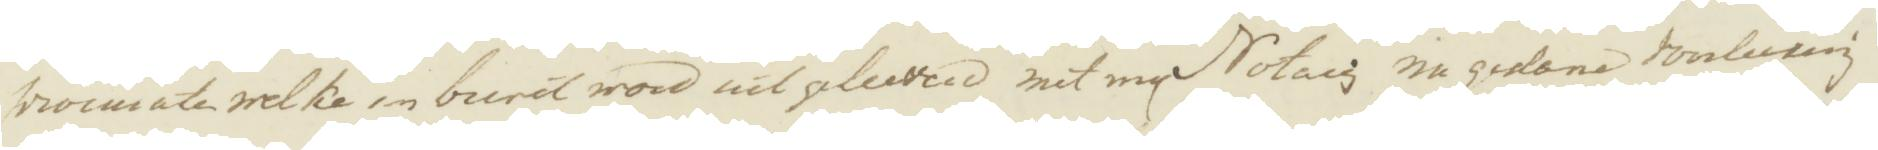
procuratie welke in beurd word uitgleeverd met my Notaris na gedane voorleezen
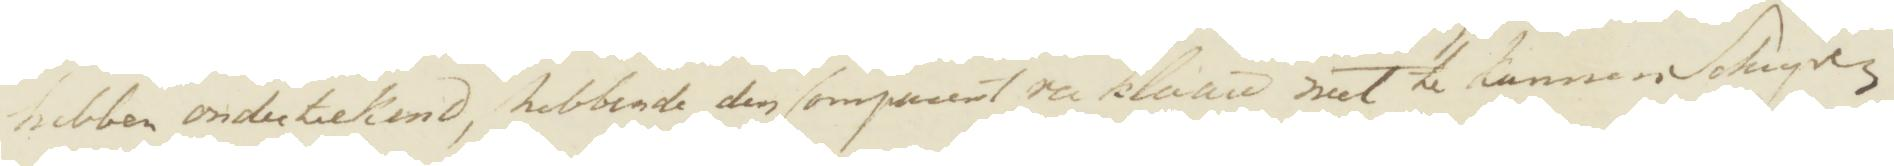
hebben onderteekend, hebbende den Comparant verklaard niet te kunnen schrijven
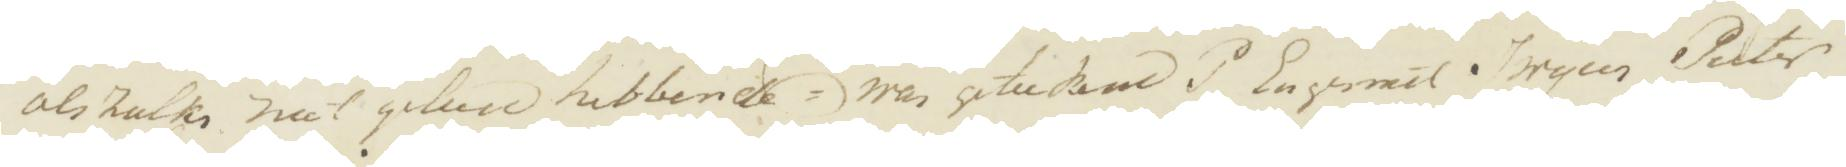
als zulks niet geleerd hebbende = was geteekend P Engesmet J wylen Pieter
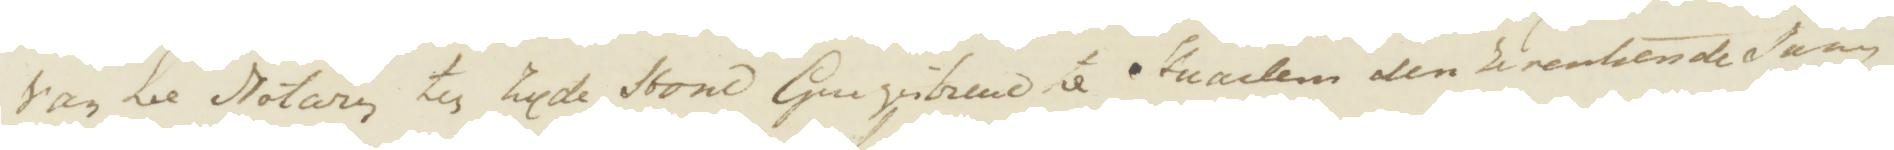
van Lee Notaris ten zyde stond Geregistreerd te Haarlem den zeventiende Juny
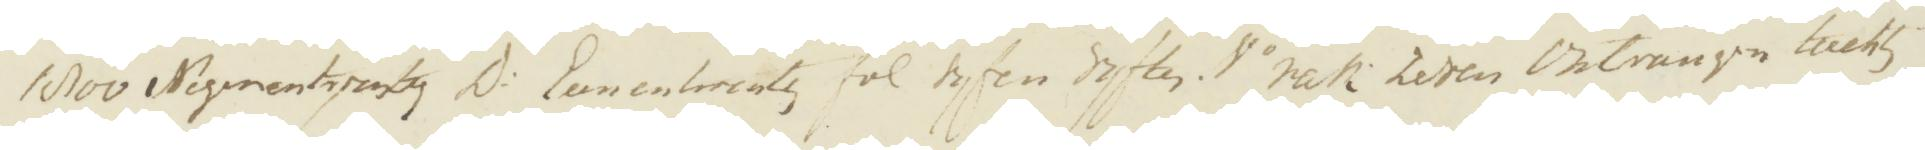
1800 Negenentwintig D: Een entwintig fol vyfen vyftig. Vo vak zeven Ontvangen tachtig
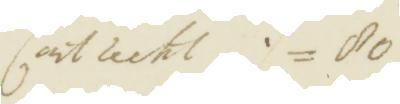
Cents recht . = 80
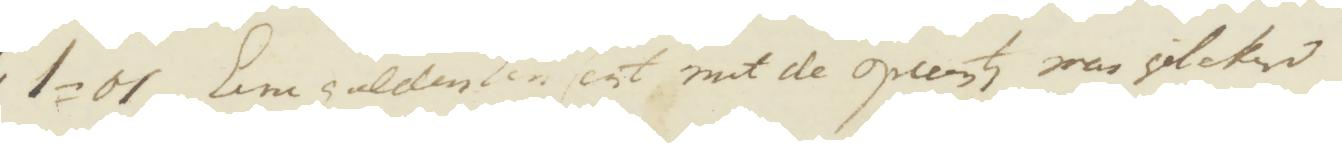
1 = 01. Eene gulden Een Cent met de opcenten was getekend
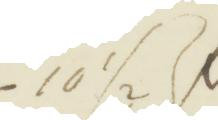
– 10½
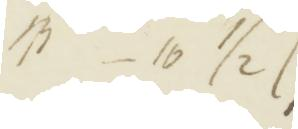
13 – 10 ½
